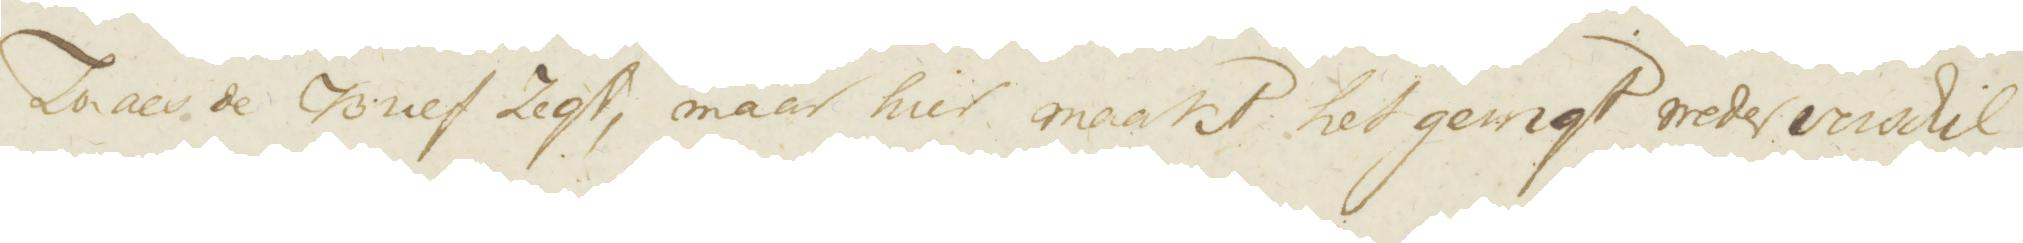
Zoals de brief zegt, maar hier maakt het gewigt weder verschil
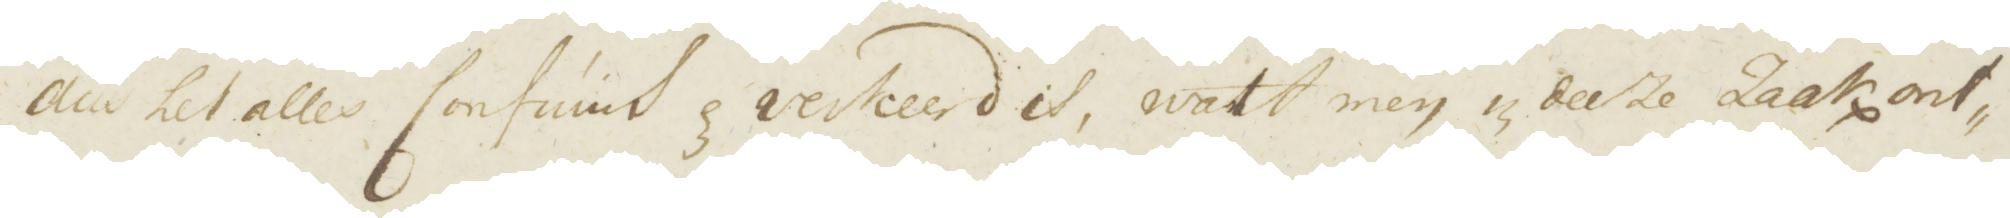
dus het alles Confuuis en verkeerd is, watt men in deeze zaak ont„
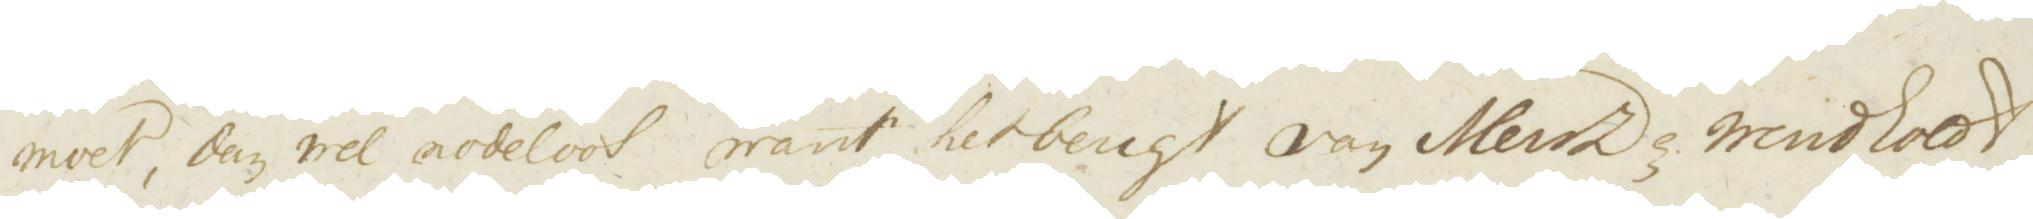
moet, dan wel nodeloos want het beugt van Meisz en windloos
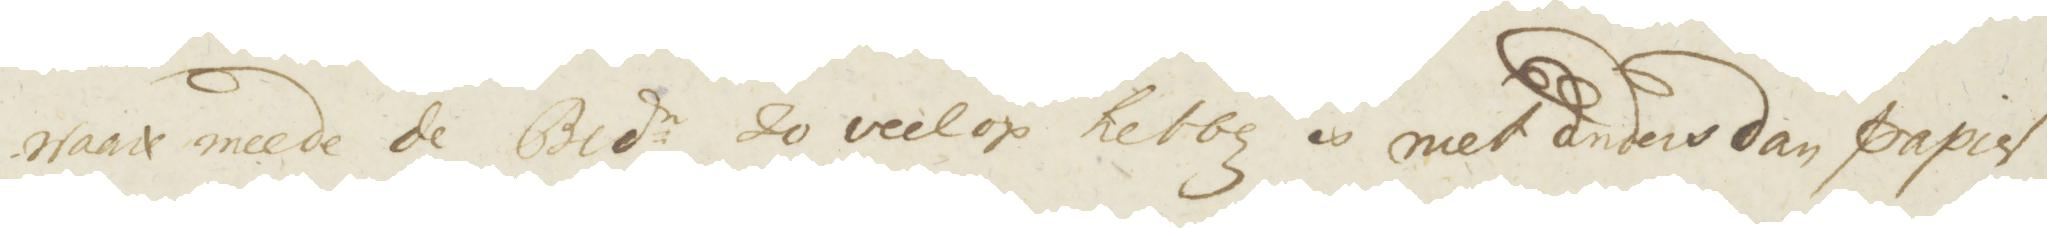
waar meede de Bed=n zo veel op hebben is niet anders dan papier
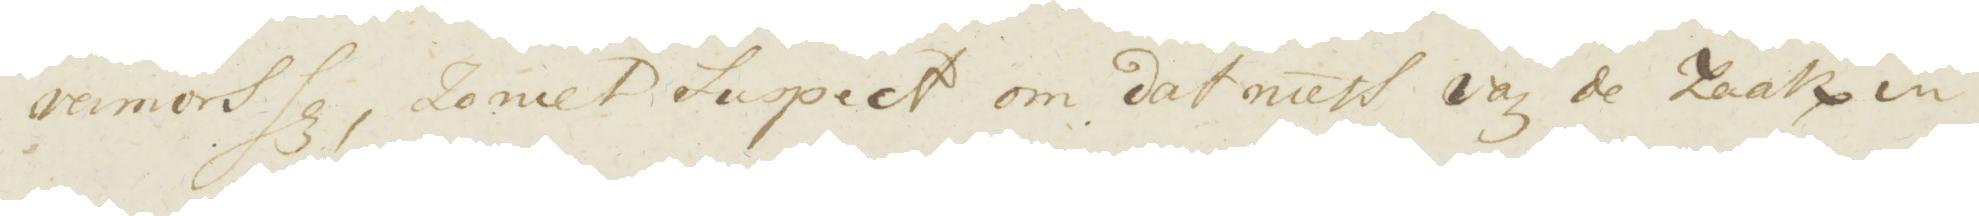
vermorssen, zo niet suspect om dat niets van de zaak in
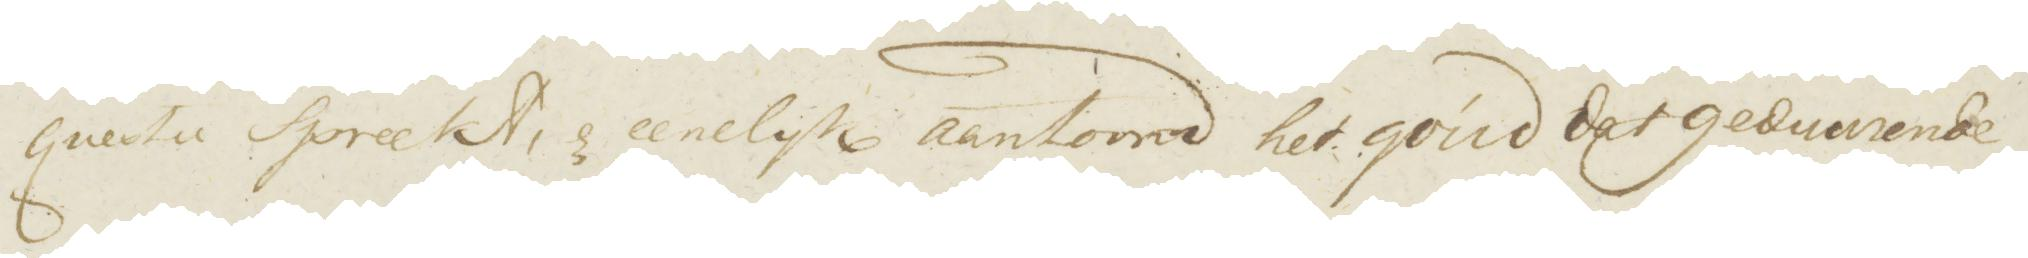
questie spreekt, en eenelijk aantoond het goud dat geduurende
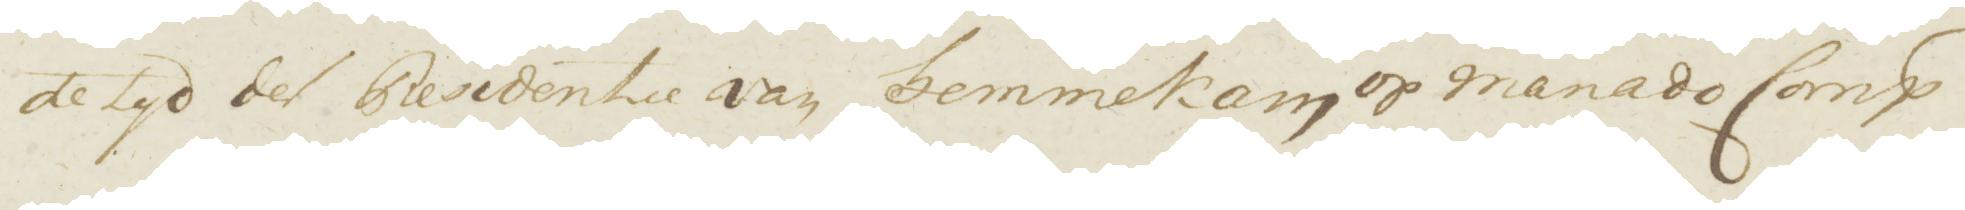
de tyd des Residentie van Hemmekam op manado Comp
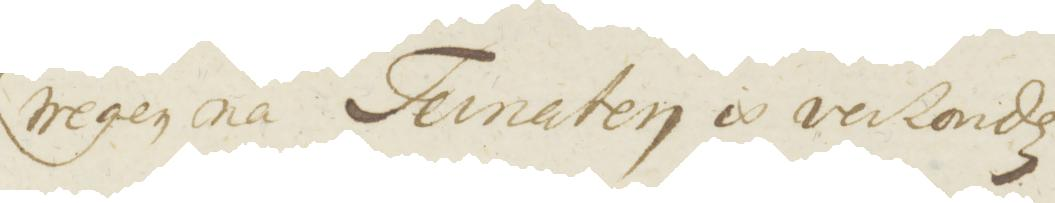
wegen na Ternaten is verzonden
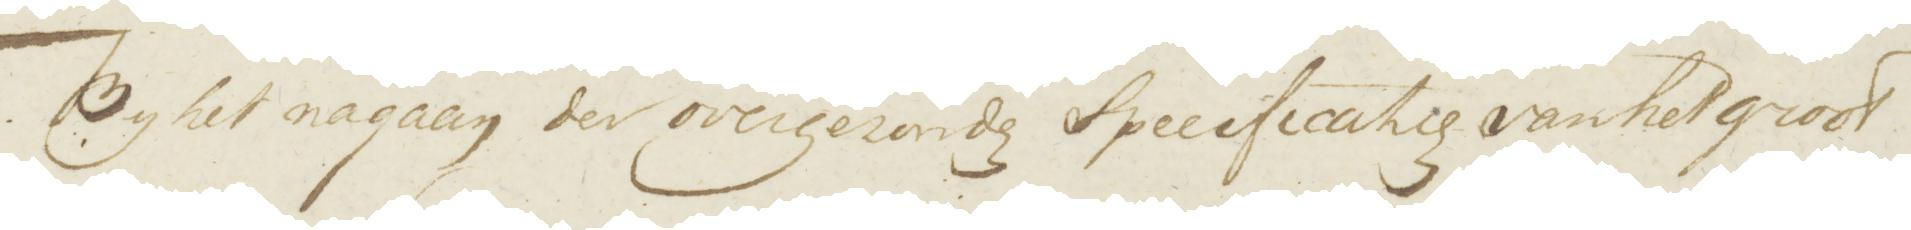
By het nagaan der overgezonden Specificatien van het groot
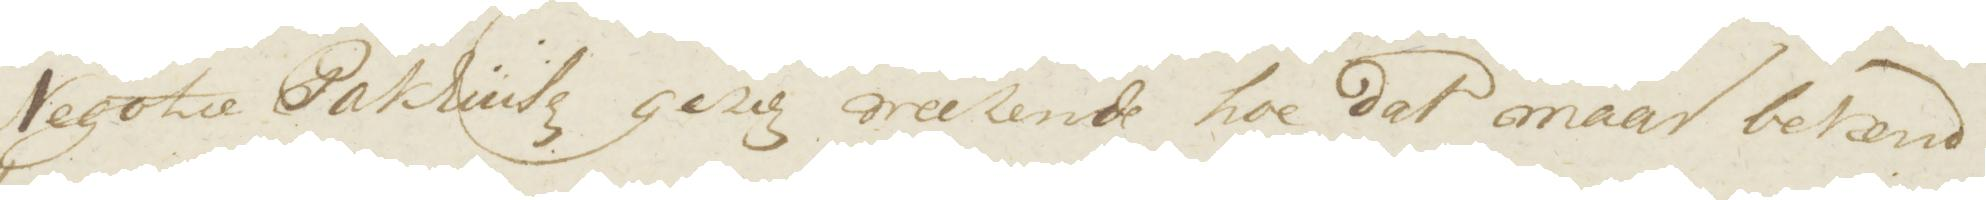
Negotie Pakhuisen gezien weezende hoe dat maar bekend
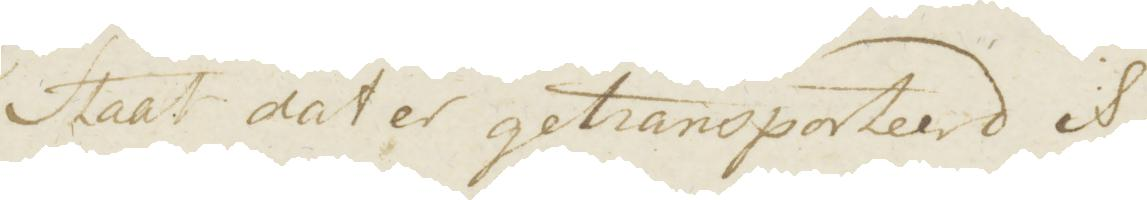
staat dat er getransporteerd is
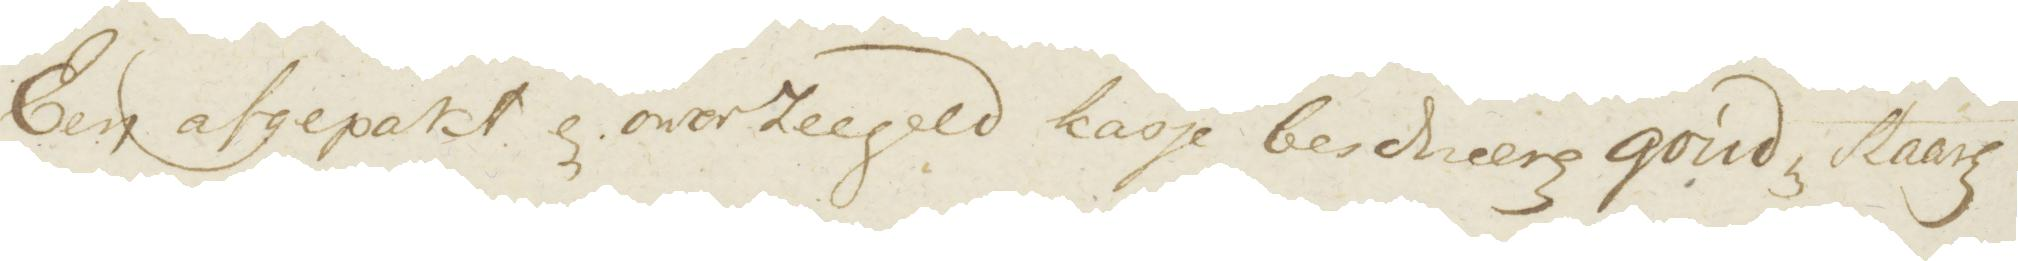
Een afgepakt en onverzeegeld kasje beschreeven goud en staaten
